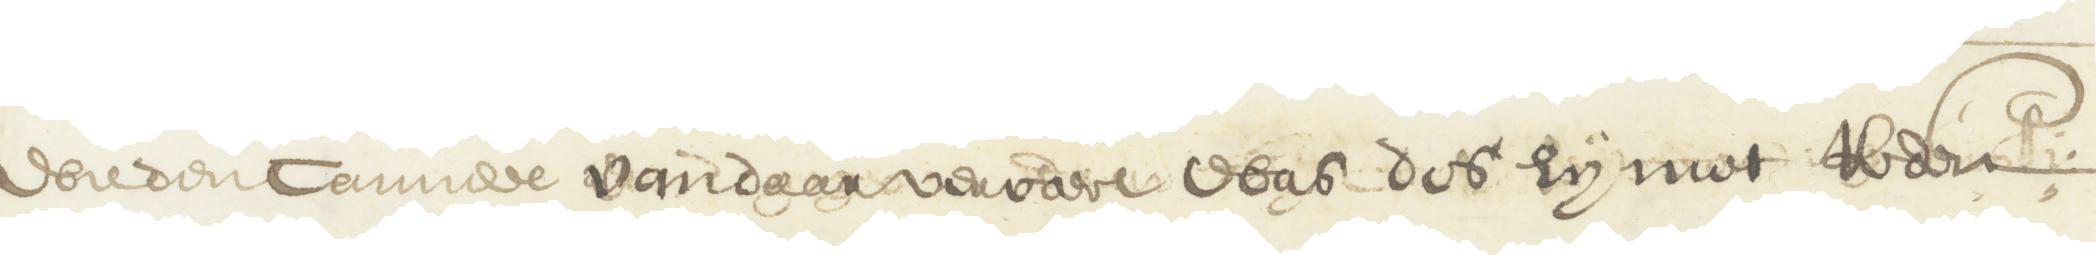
wilden Canneel vandaar vervoert was des hij met reden
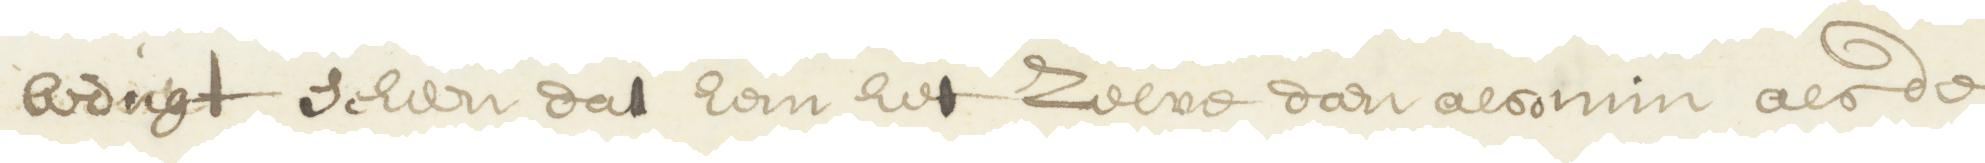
bedugt scheen dat hem het Zelve dan alsomin als de
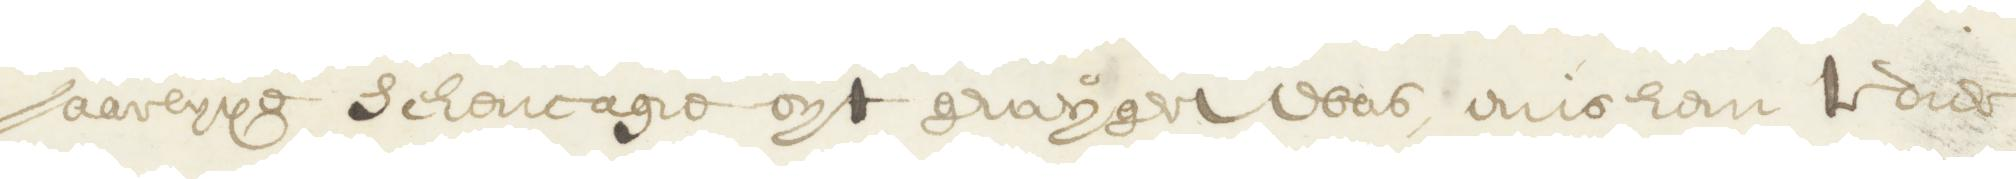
Jaarlijxe schencagie oijt gewijgert was, en is hem te dier
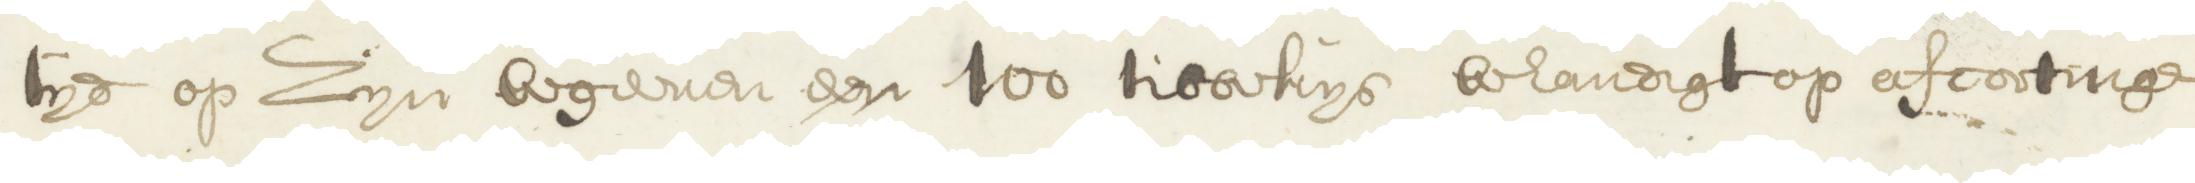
tijd op Zijn begeeren den 100 tibbekijs behandigt op afcortinge
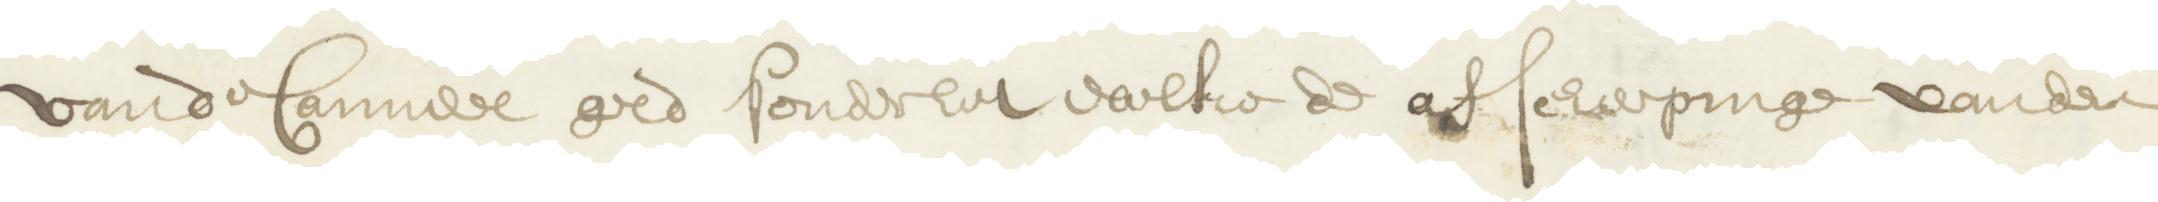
van de canneel geld sonder het volke de afscheepinge van den
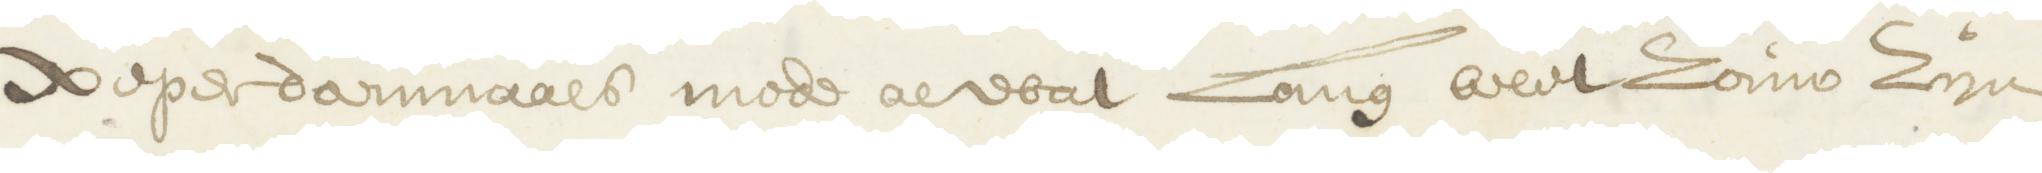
peper doenmaals mede alwat Lang belet Zouw Zijn
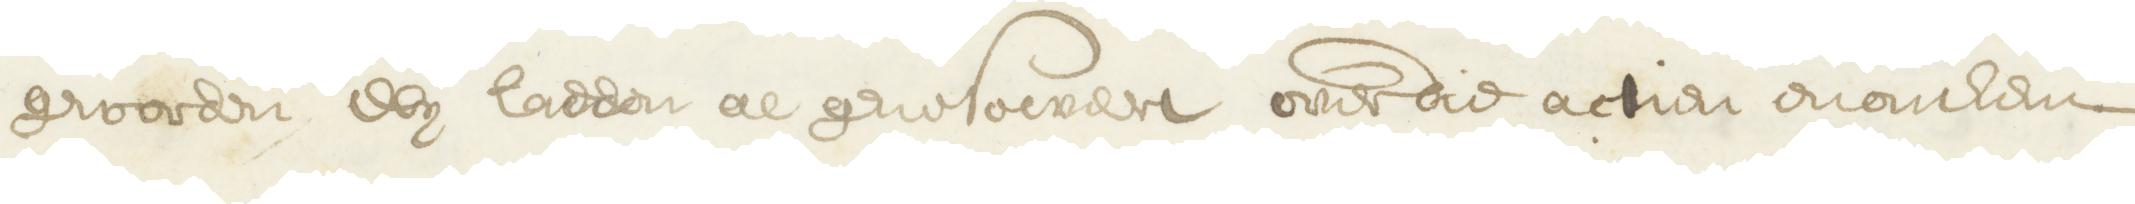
geworden, wij hadden al geresolveert over die actien en om hem
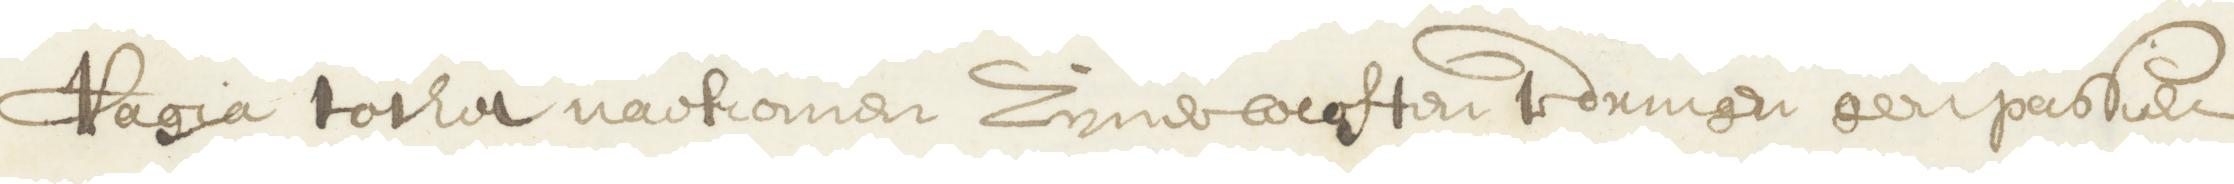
Ragia to thet naekomen Zijne beloften tedringen geen passie
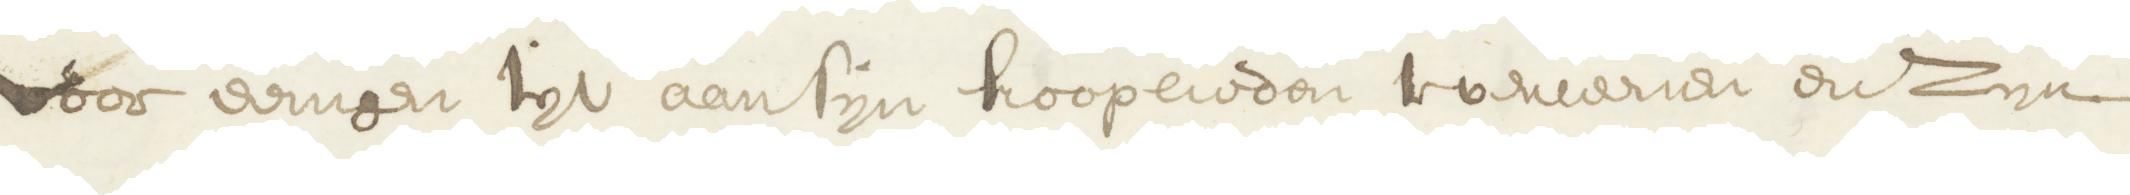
voor eenigen tijt aan sijn kooplieden te verleenen en Zijn
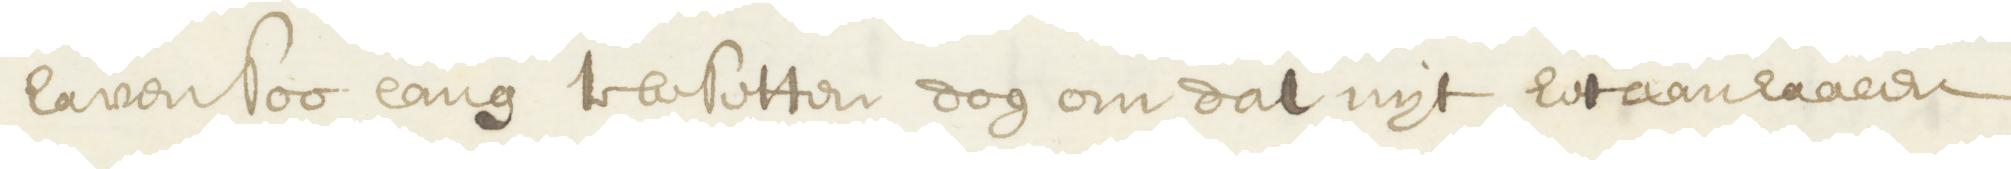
haven Soo lang te besetten dog om dat uijt het aanhaalen
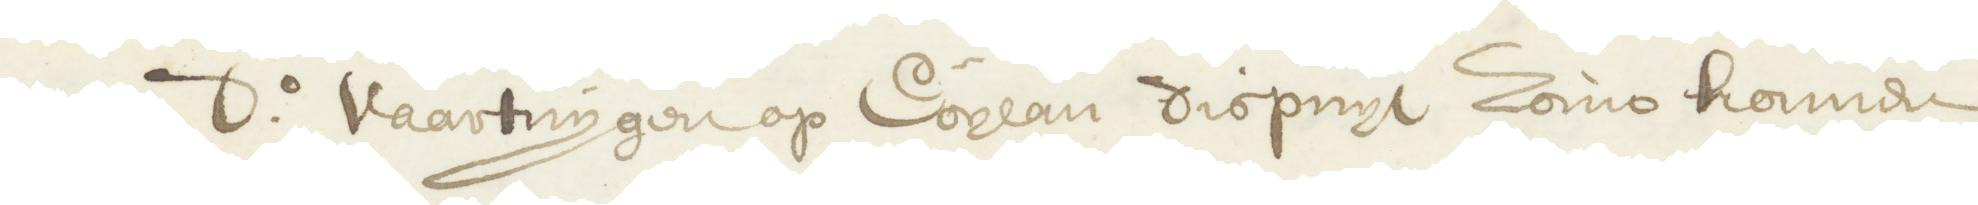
van D.o vaartuijgen op Coijlan dispuijt Zouw konnen
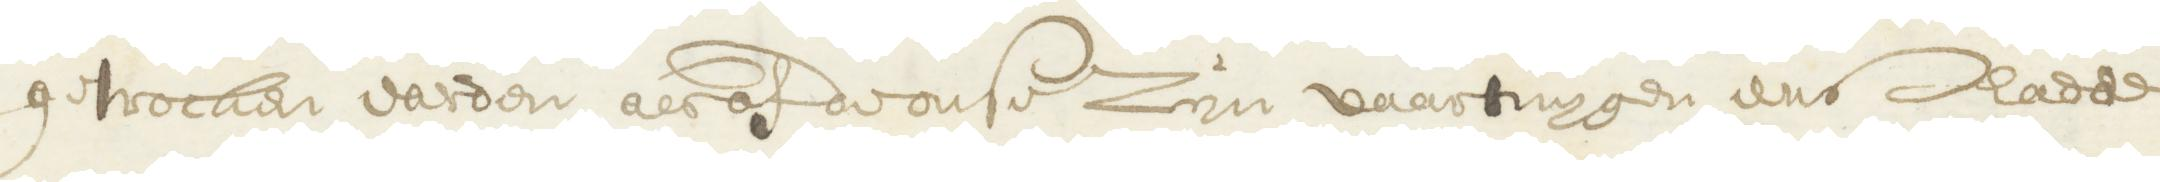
getrocken werden als of de onse Zijn vaartuijgen eerst hadde
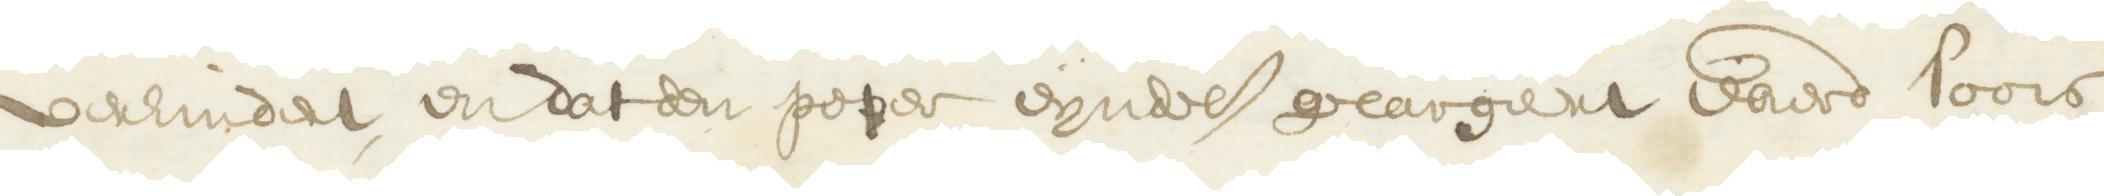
verhindert, en dat den peper eijndelijk gelargert weerd soo is
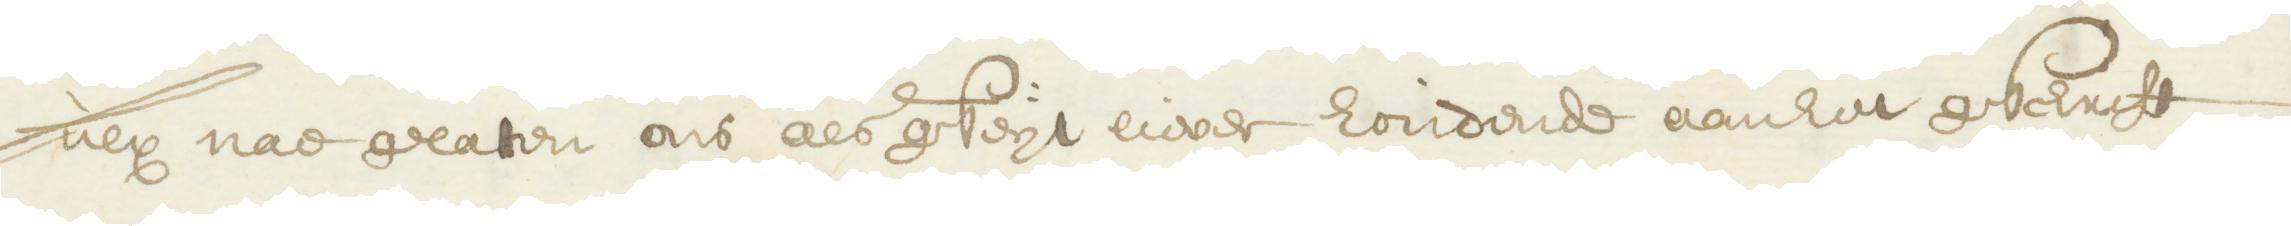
sulx nae gelaten ons als geseijt liever houdende aan het geschrift
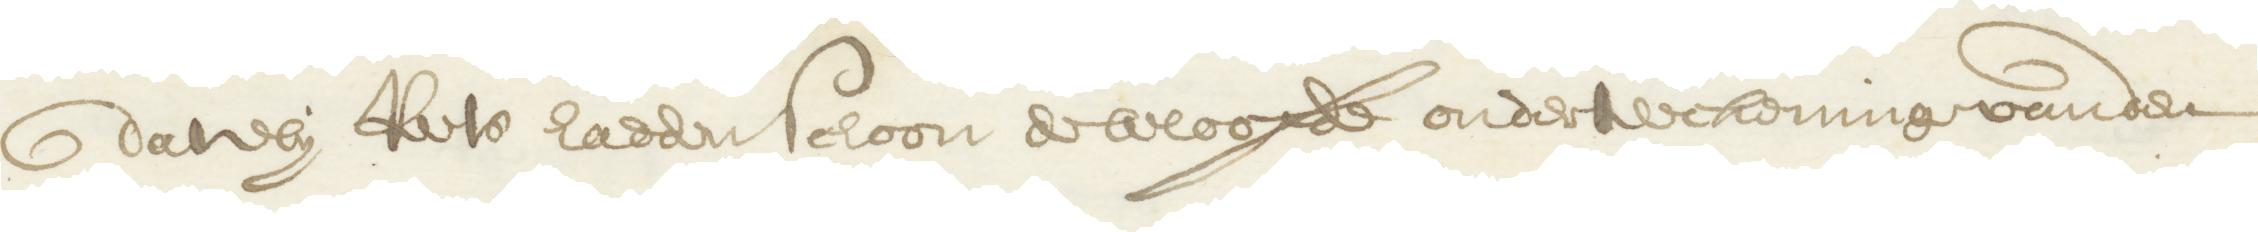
datwij Reets hadden schoon de beloofde onderteeckening van den
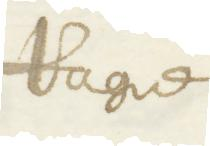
Ragie
